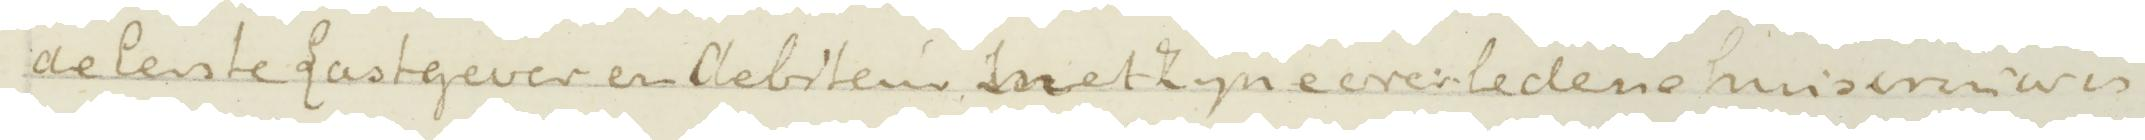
de Eerste Lastgever en debiteur met zyne overledene huisvrouw is
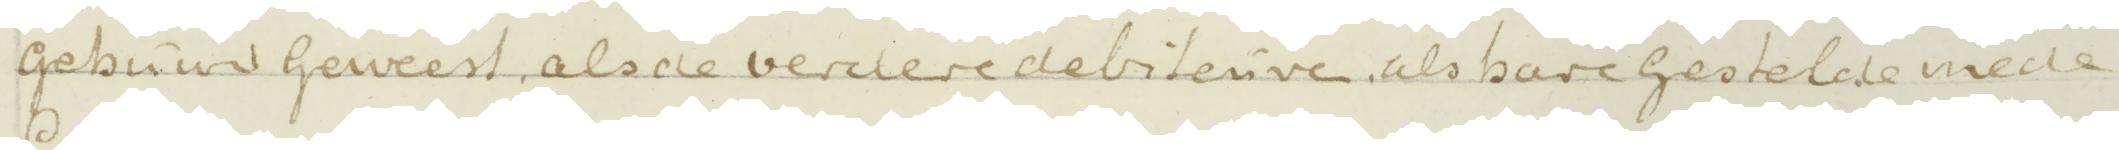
gehuurd geweest, als de verdere debiteure, als hare gestelde mede
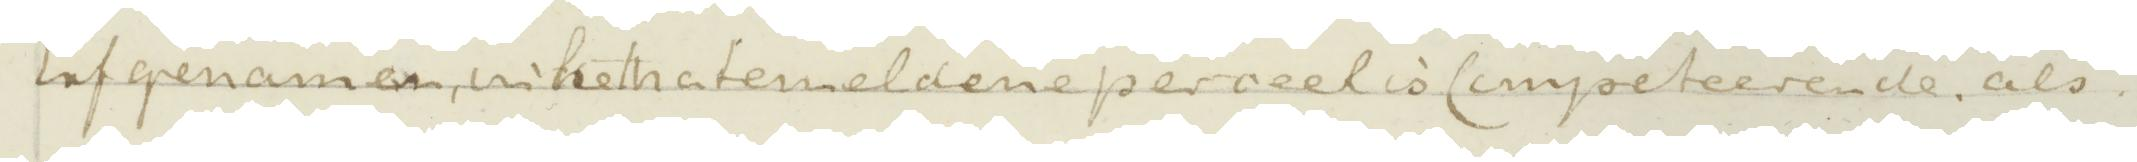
Erfgenamen, in het natemeldene perceel is Competeerende, als
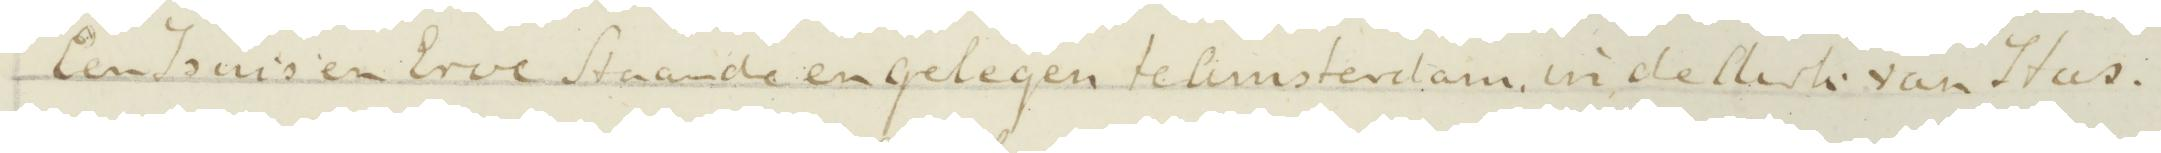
Een huis en Erve staande en gelegen te amsterdam, in de Dirk van Has.
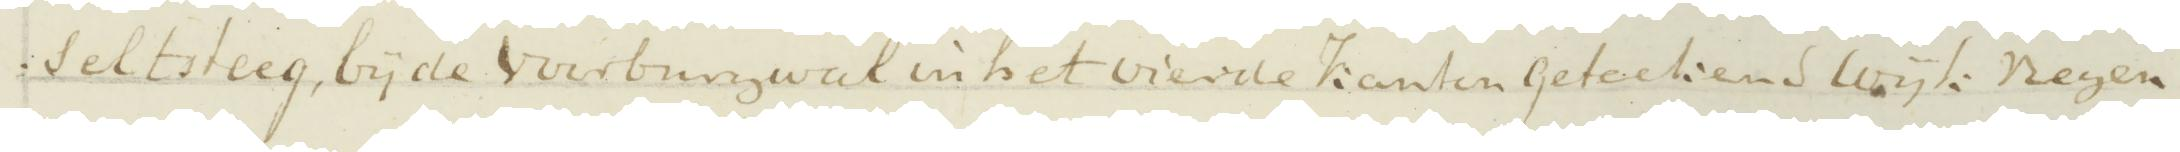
=seltsteeg, bij de voorburgwal in het vierde kanton geteekend wijk negen
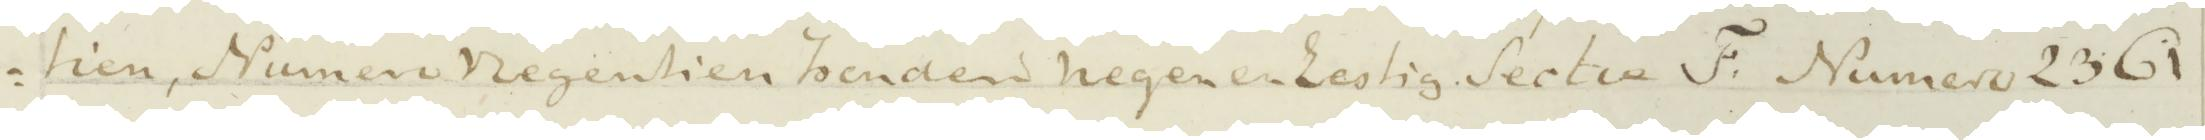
=tien, Numero Negentien honderd negen en zestig sectie F. Numero 2361
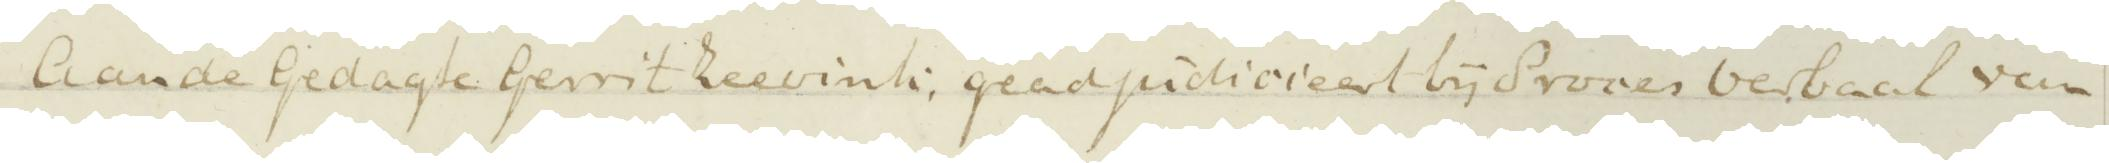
Aan de Gedagte Gerrit zeevink, geadjudicieert bij Proces verbaal van
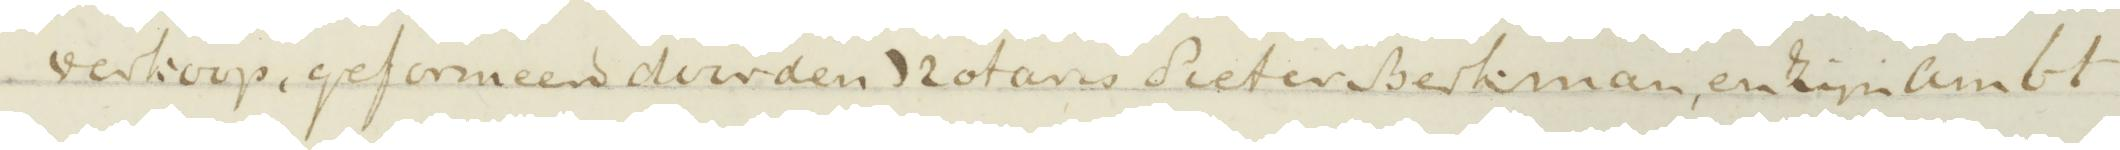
verkoop, geformeerd door den notaris Pieter Berkman, en zijn ambt
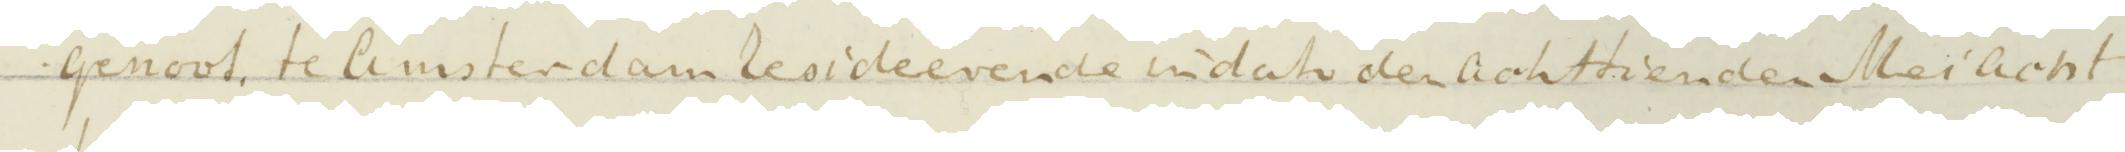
-genoot, te Amsterdam resideerende in dato den achttienden Mei acht
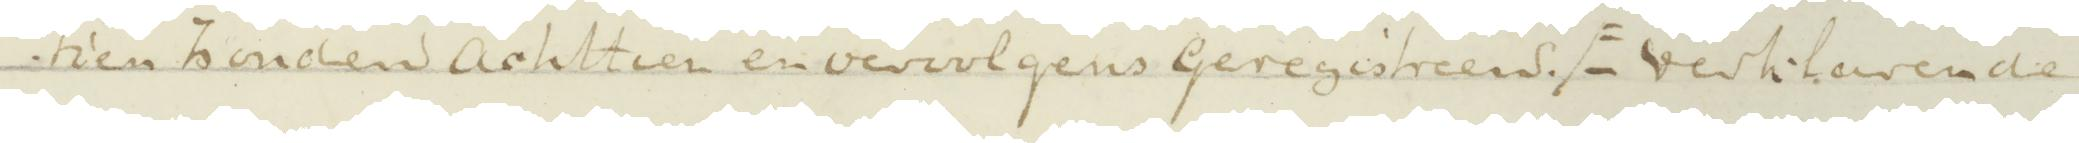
-tien honderd achttien en vervolgens Geregistreerd. ¶– verklarende
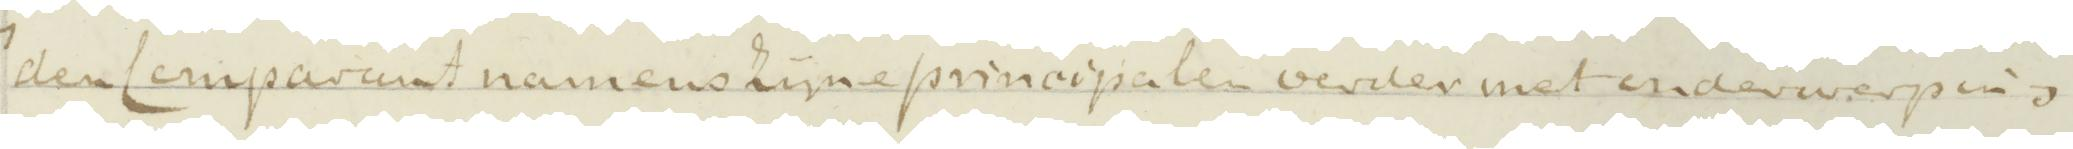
den Comparant namens zijne principalen verder met onderwerping
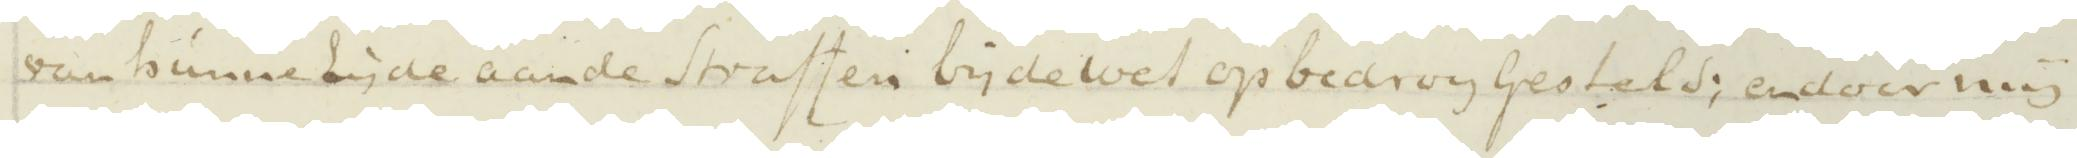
van hunne zijde aan de Straffen bij de wet op bedrog Gesteld; en door mij
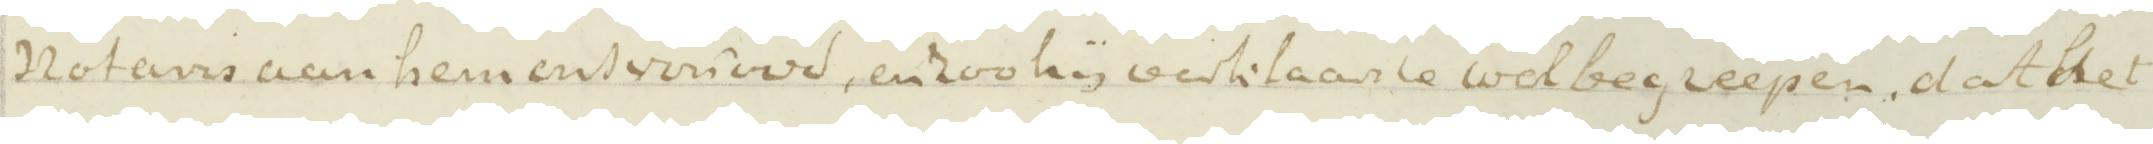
Notaris aan hem ontvouwd, en zoo hij verklaarde wel begreepen, dat het
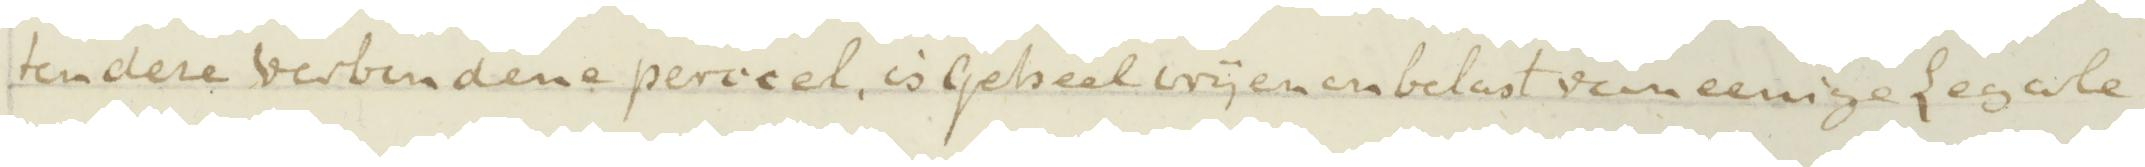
ten deze verbondene perceel, is Geheel vrij en onbelast van eenige Legale
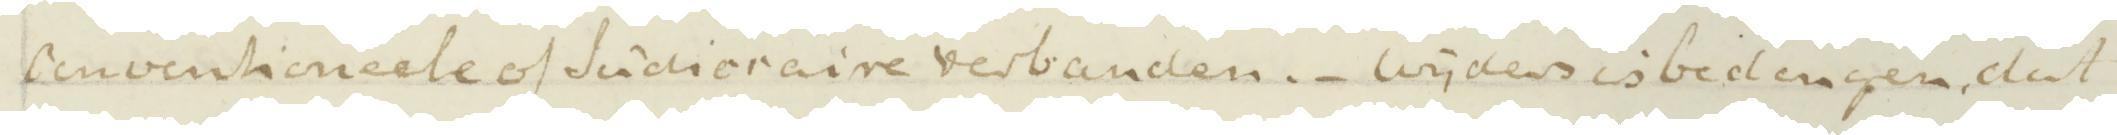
conventioneele of Iudicraire verbanden. – wijders is bedongen, dat
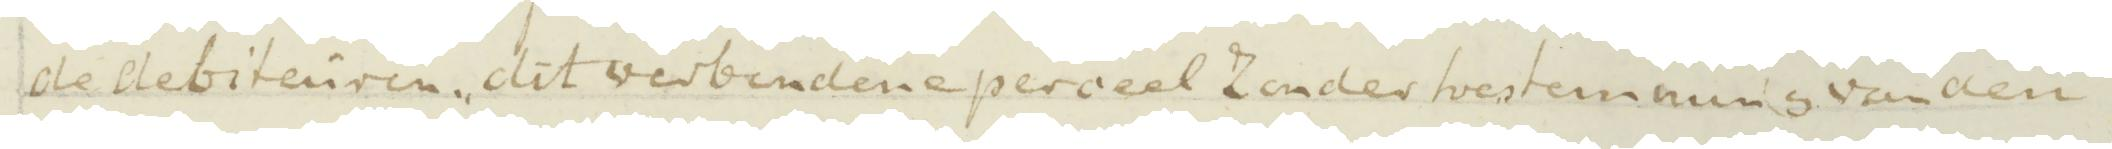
de debiteuren, dit verbondene perceel zonder toestemming van den
